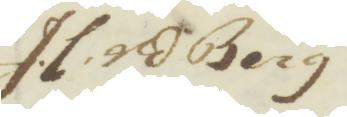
J.C. vd Berg
